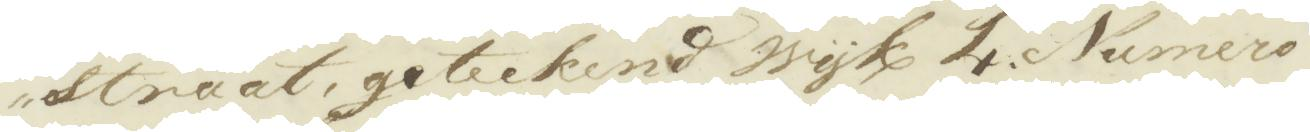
„straat, geteekend Wijk 4. Numero
